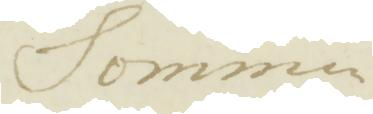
Somma
